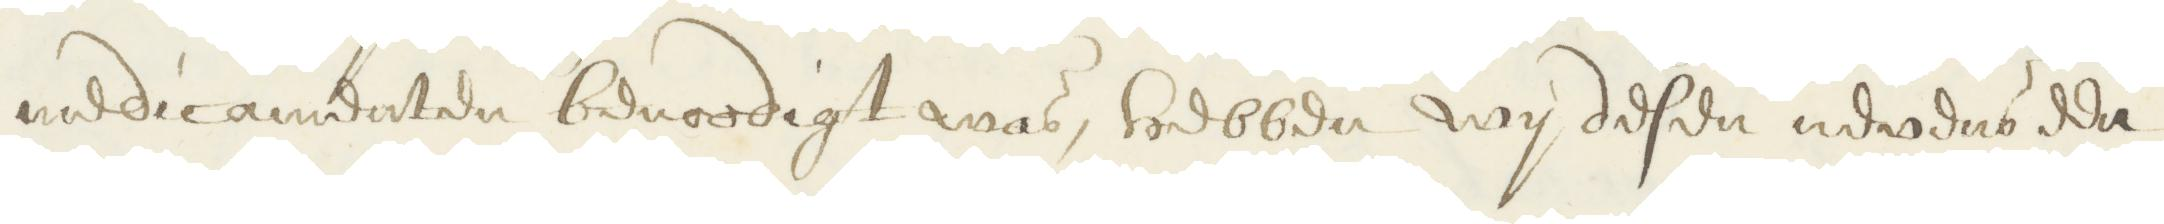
medicamenten benoodigt was, hebben wij desen nevens een
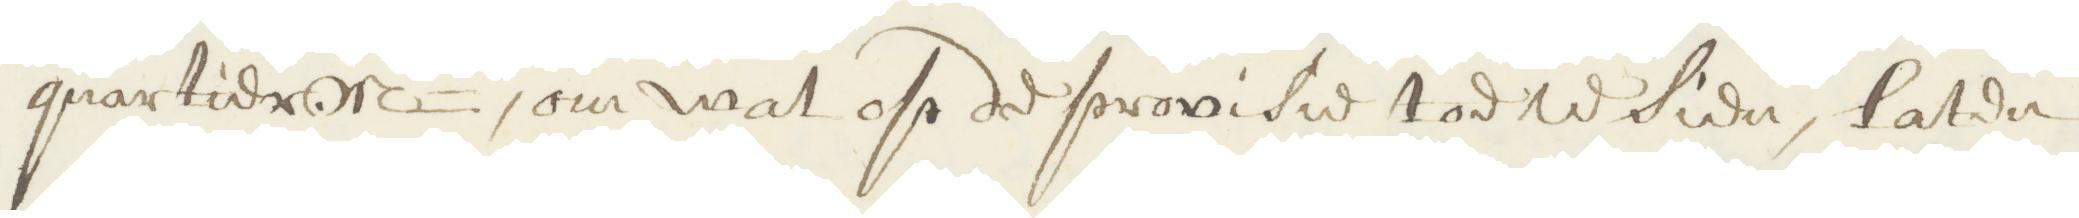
quartier M=, om wat op de provisie toe te sien, laten
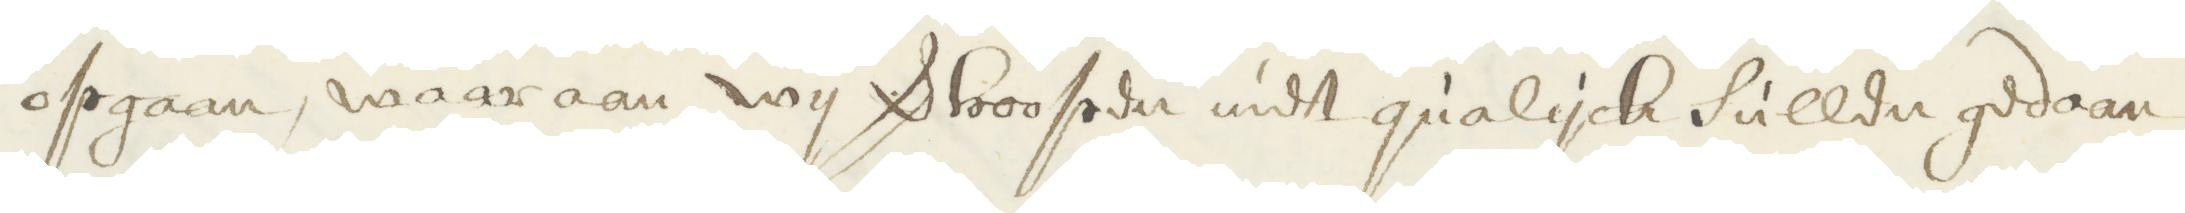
opgaan, waar aan wij verhoopen niet qualijck sullen gedaan
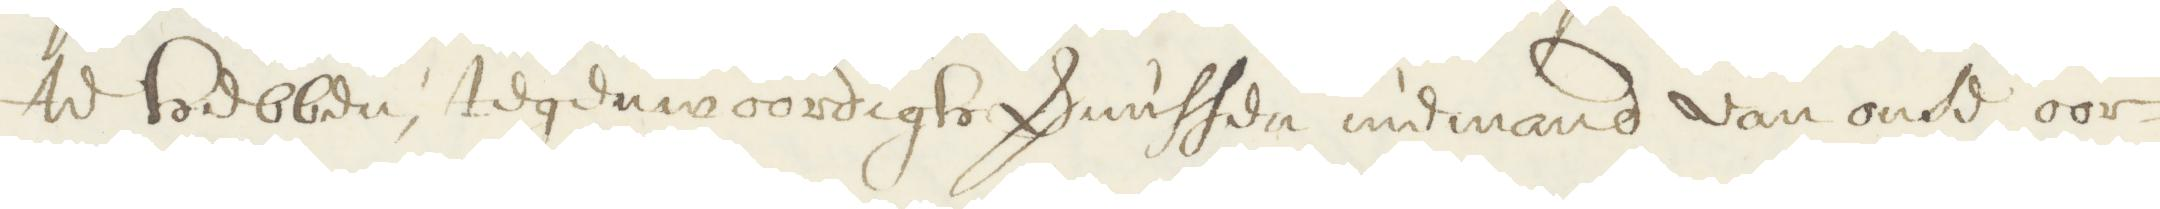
te hebben; tegenwoordigh vernussen niemand van onse oor-
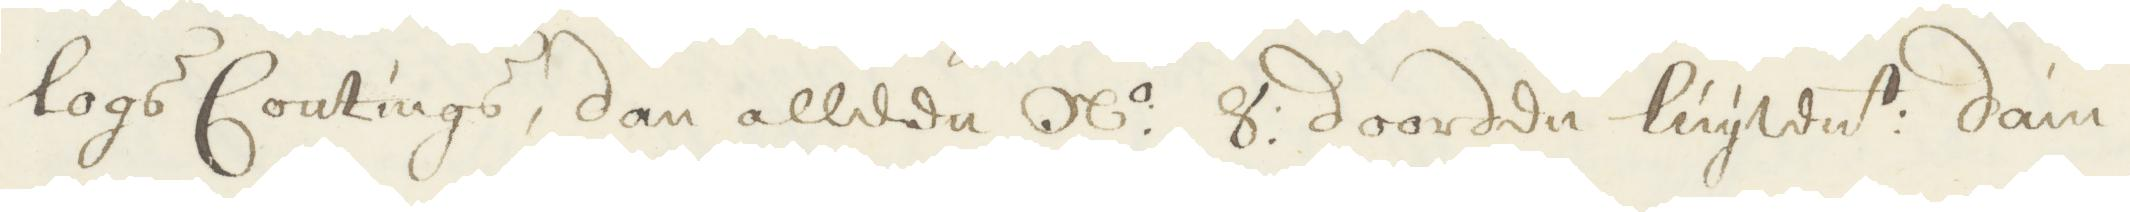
logs contings, dan alleen N:o 8: door den luijten: dain
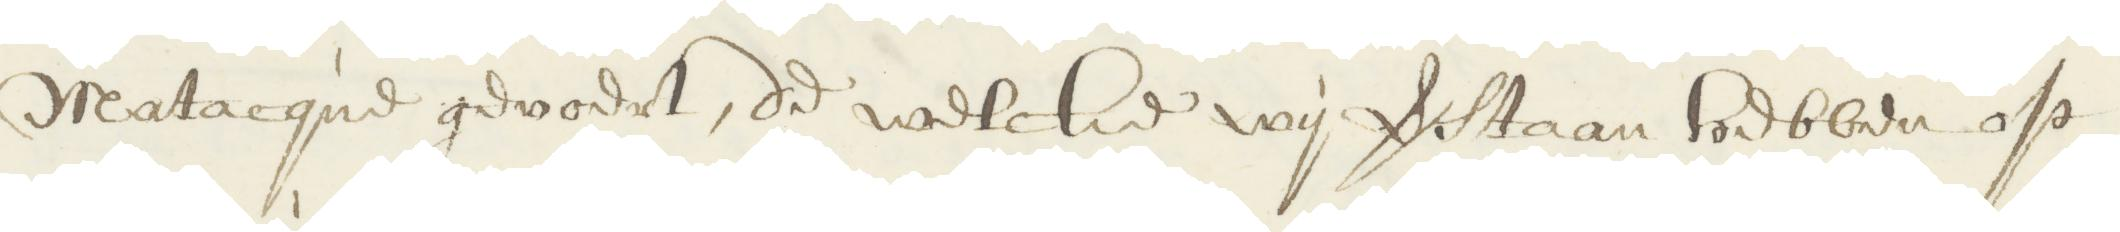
Matacque gevoert, de welche wij verstaan hebben op
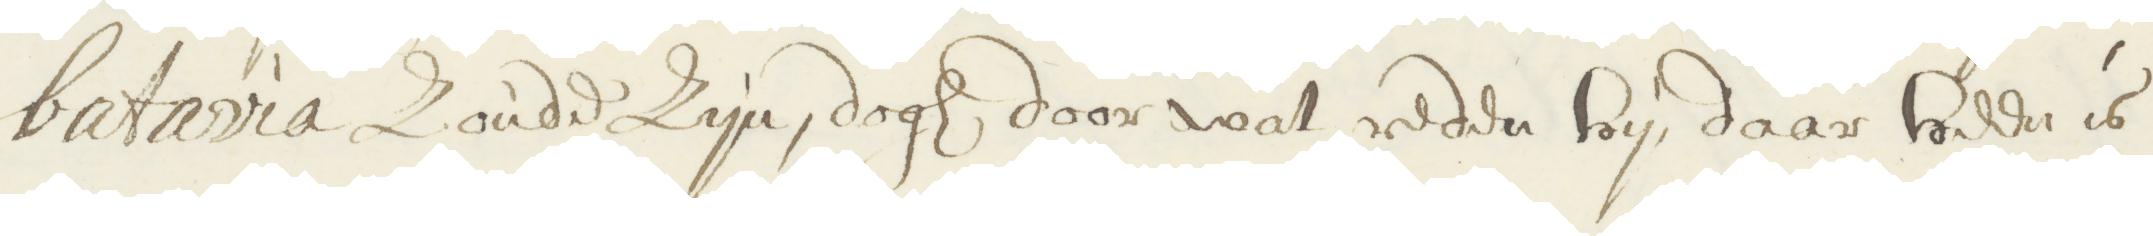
bavavia zoude zijn, dogh door wat reden hij daar heen is
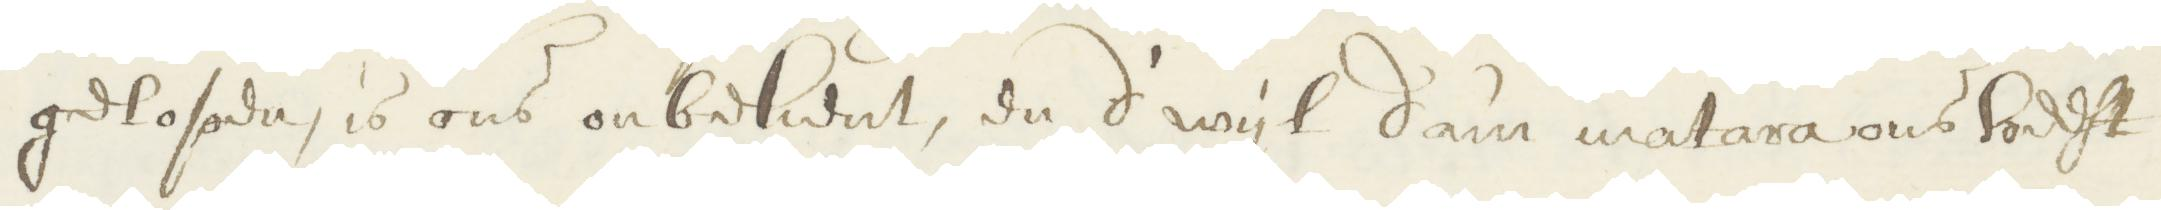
gelopen, is ons onbekent, en d’ wijl dain matara ons heeft
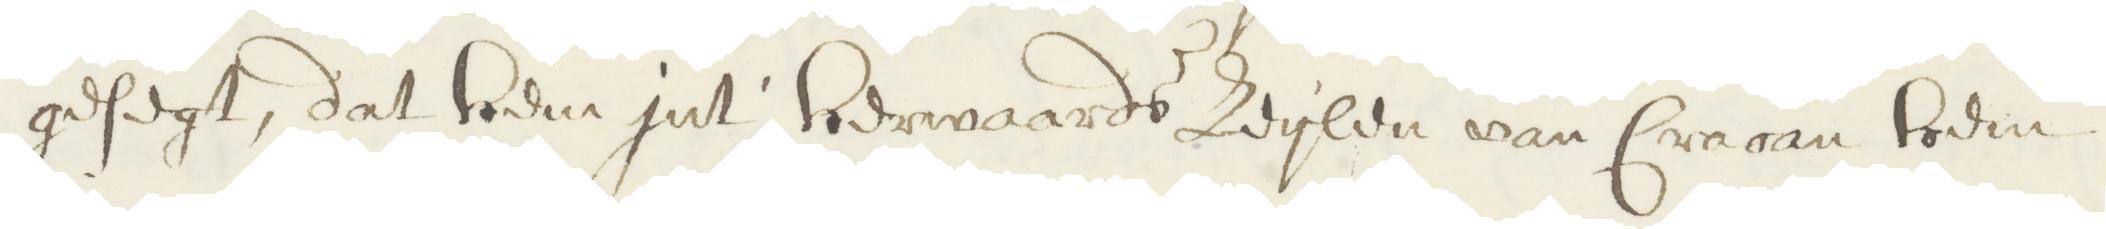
gesegt, dat hem int' herwaards zeijlen van cravan hem
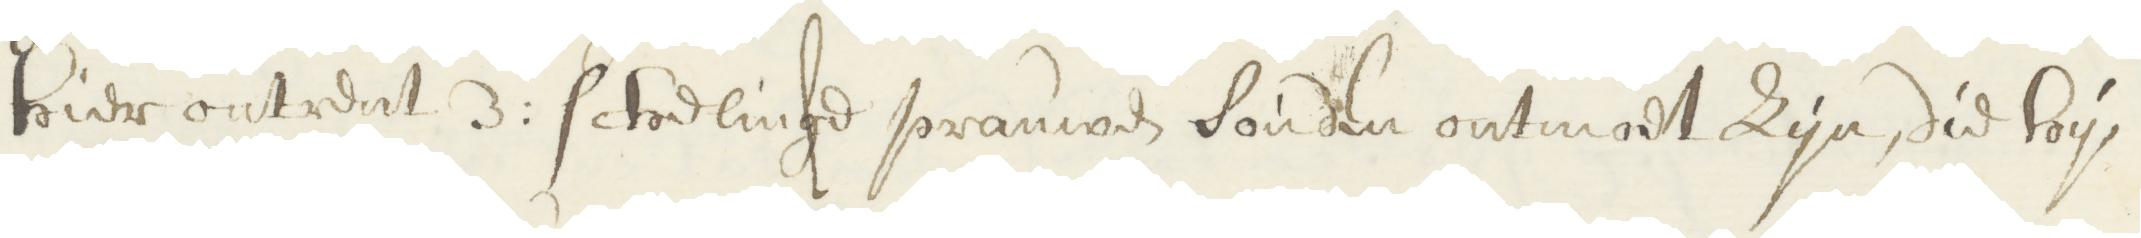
hier ontrent 3: schelingse prauwen souden ontmoet zijn, die hij
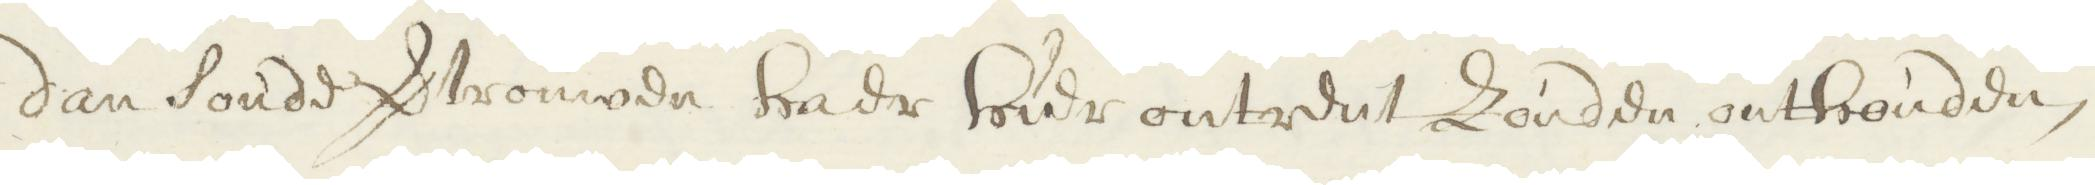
dan soude vertrouwen haer hier ontrent zouden onthouden,
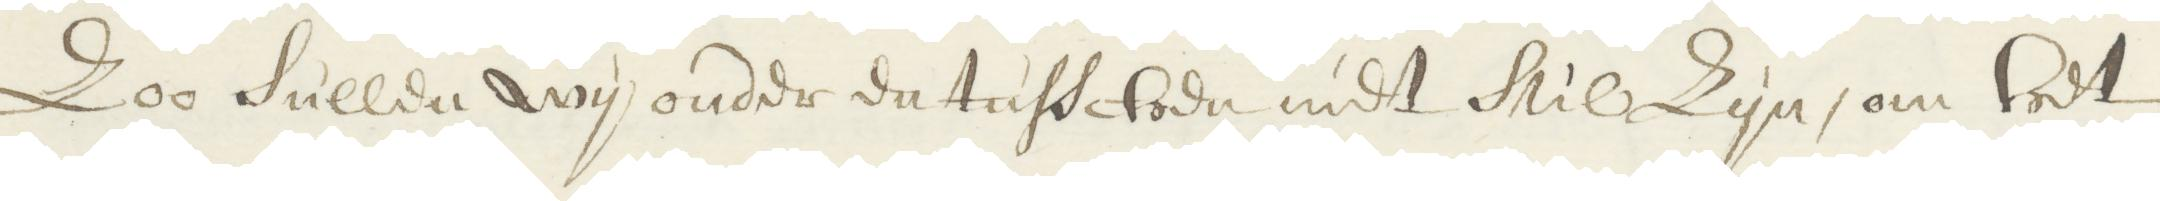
zoo sullen wij onder en tusschen niet stil zijn, om het
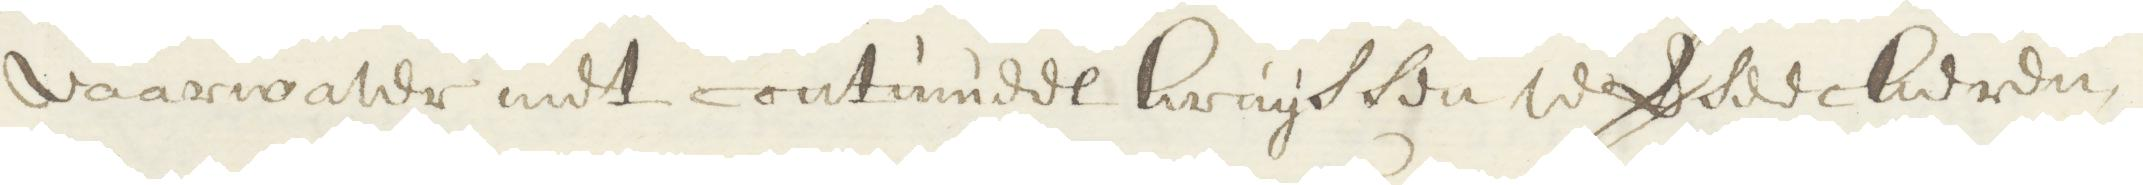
vaarwater met continueel kruijssen te verseeckeren,
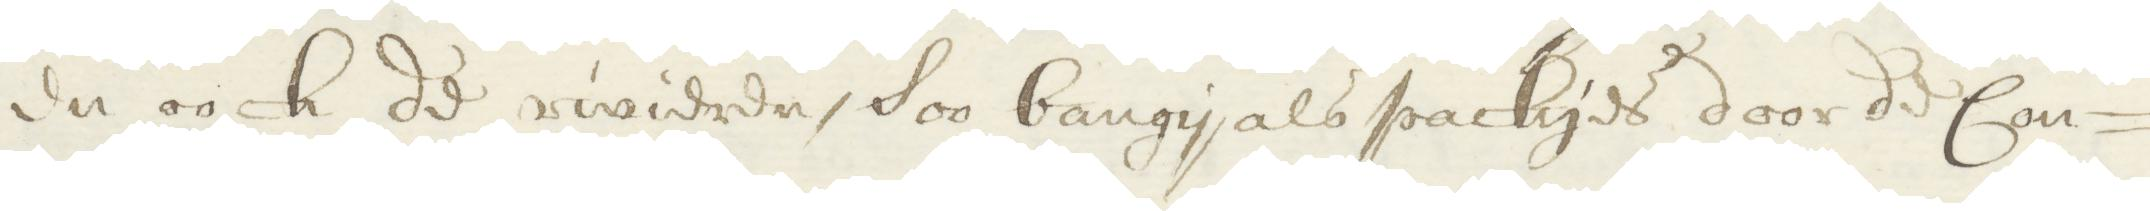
en oock de rivieren, soo bangij als packjes door de con=
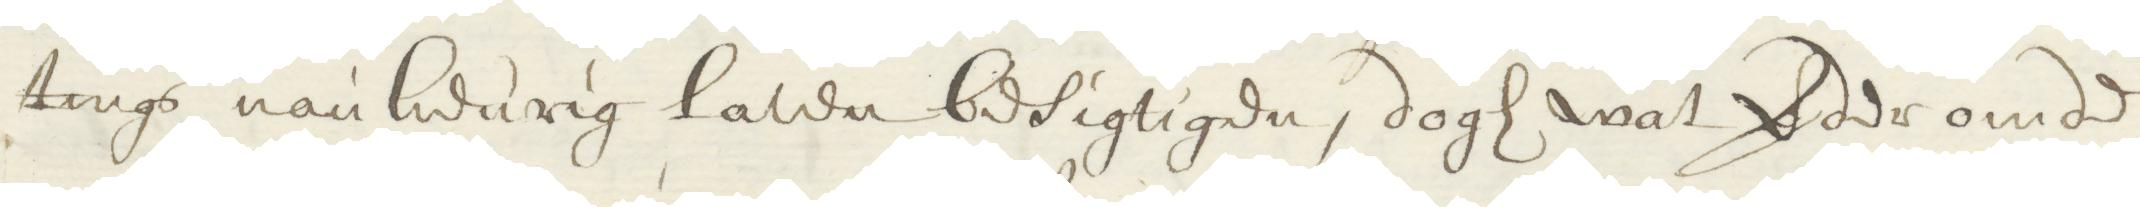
tings nau keurig laten besigtigen, dogh wat verder om de
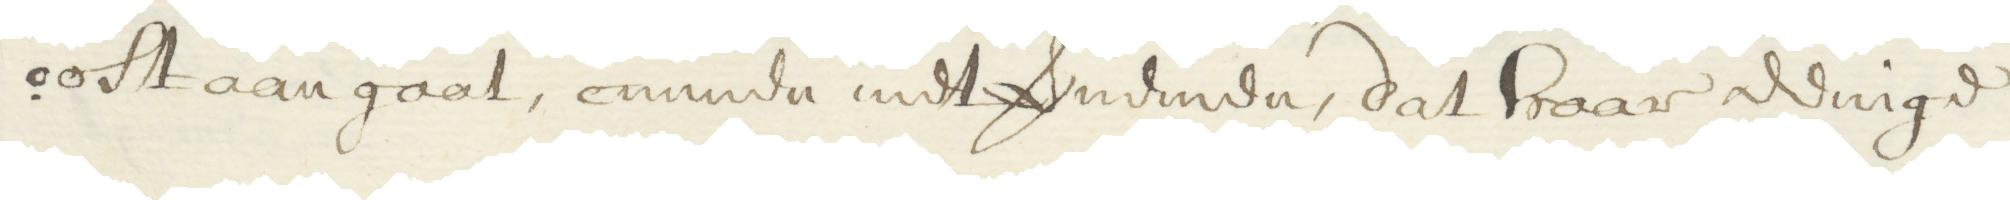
oost aangaat, cunnen niet vernemen, dat haar eenige
